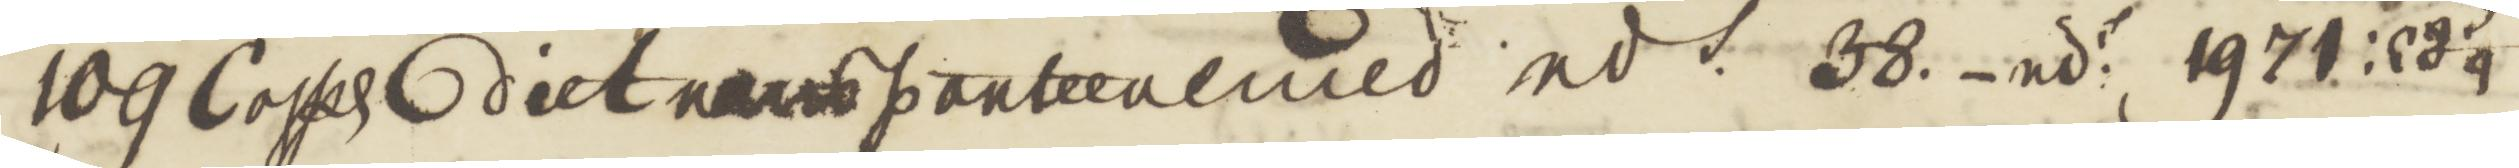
109 Coppen dietransporteeremed rd.s 38. — rd:s 1971:58¾
